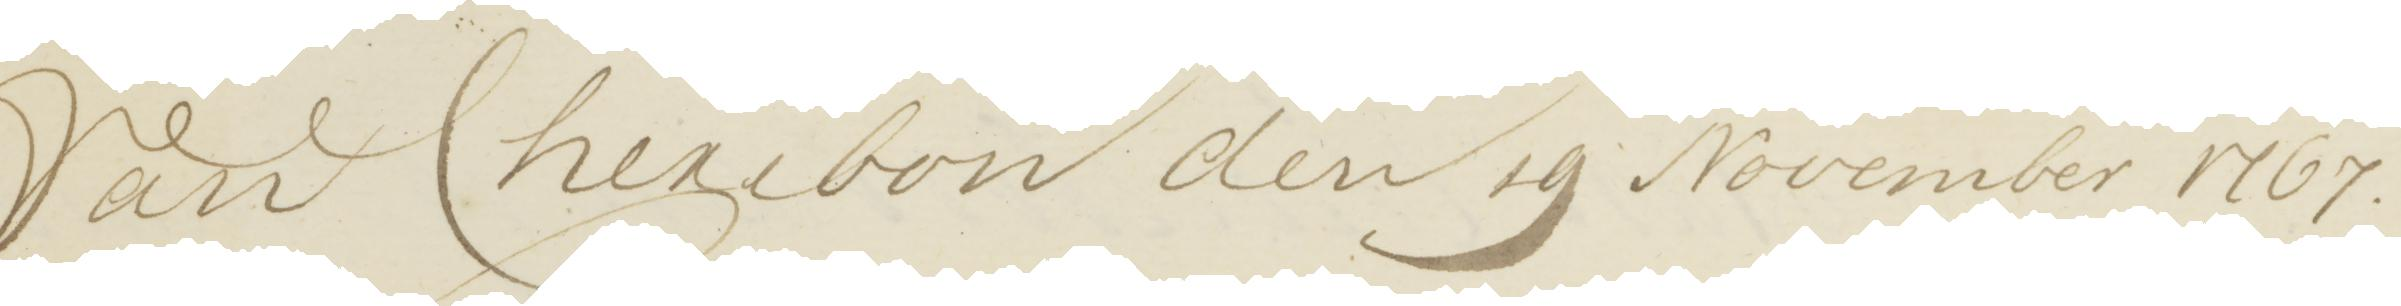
Van Cheribon den 19 November 1767.
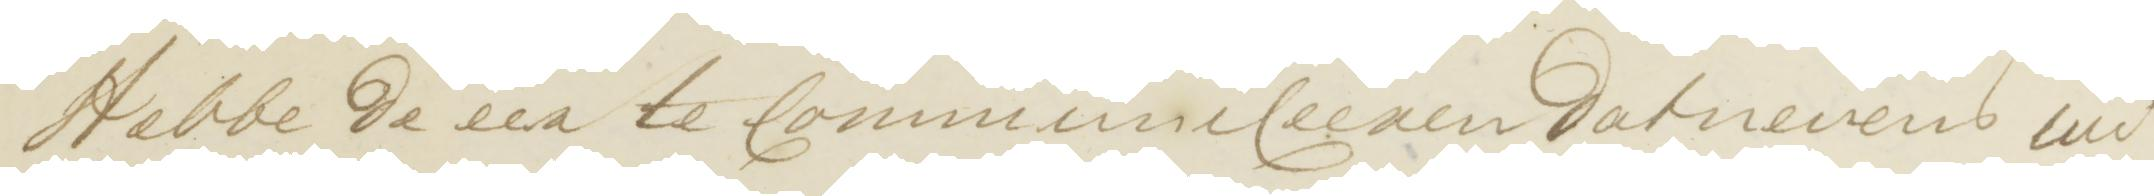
hebbe de eer te communiceeren dat nevens uw
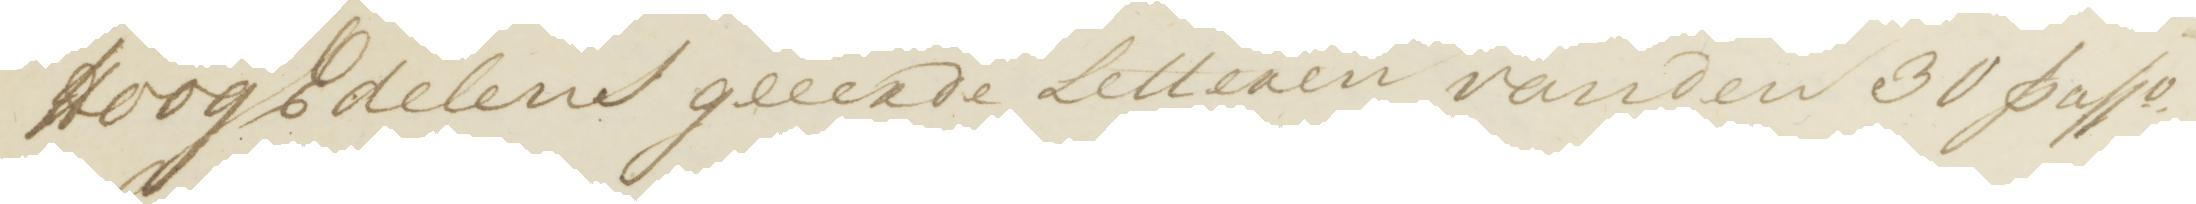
Hoog Edelens geeerde letteren van den 30 passo
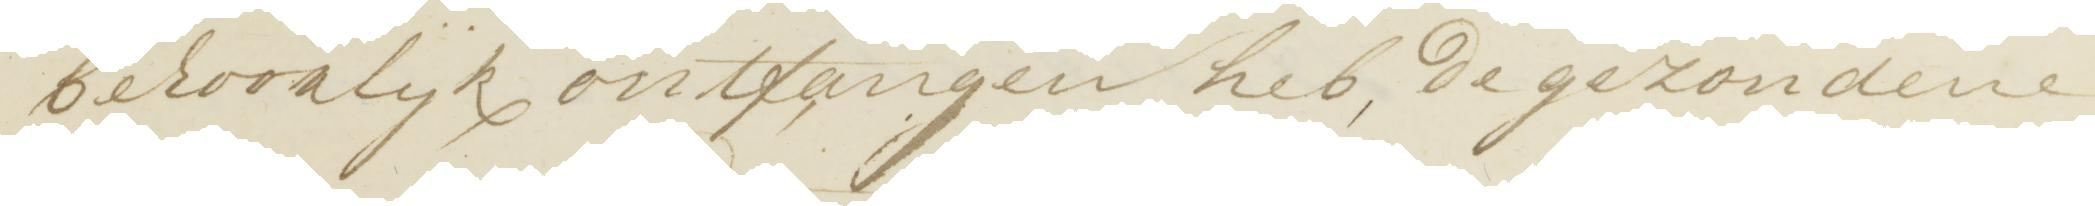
behoorlijk ontfangen heb, de gezondene
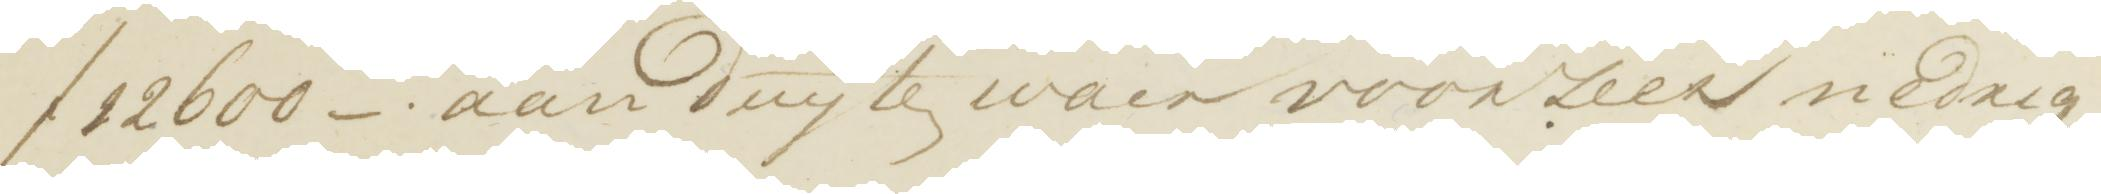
ƒ12600 – . aan duijte waer voor zeer nedrig
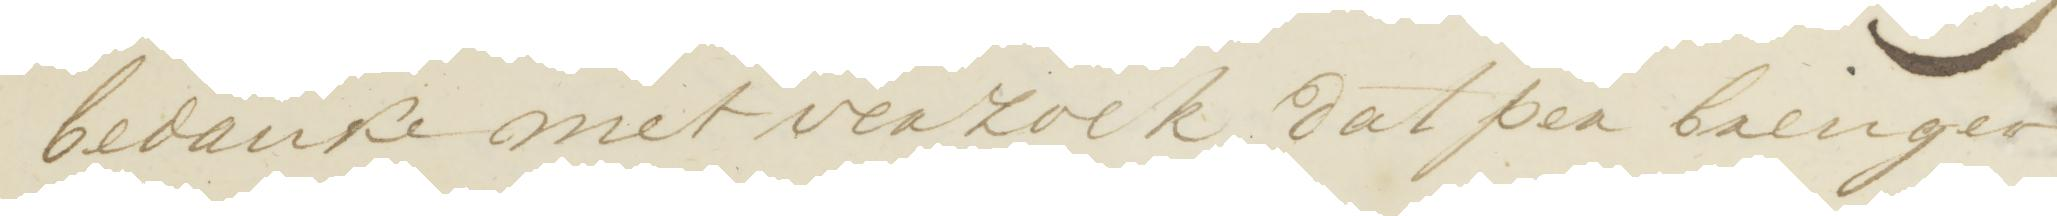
bedanke met verzoek dat per brenger
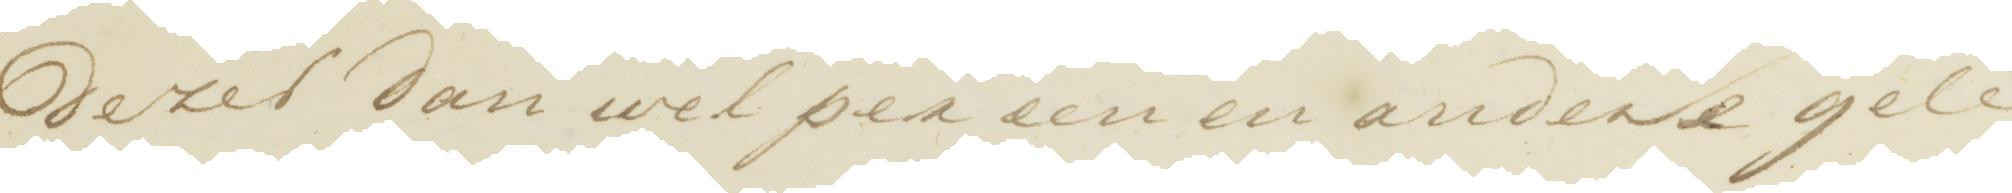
dezes dan wel per een en andere gele
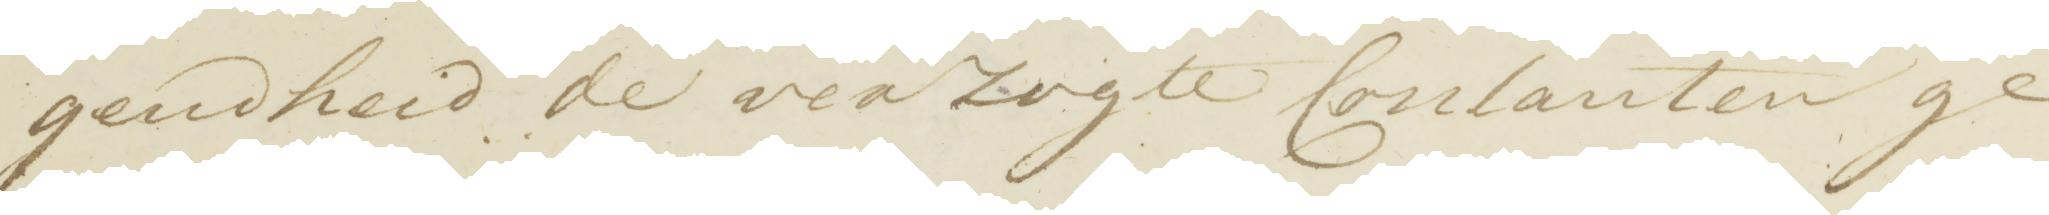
gendheid de verzogte contanten ge
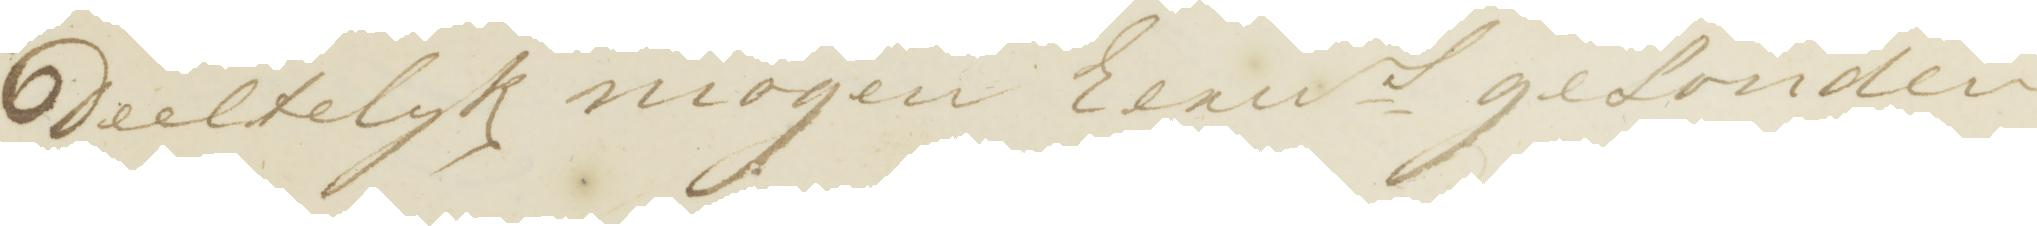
deeltelijk mogen herw=s gesonden
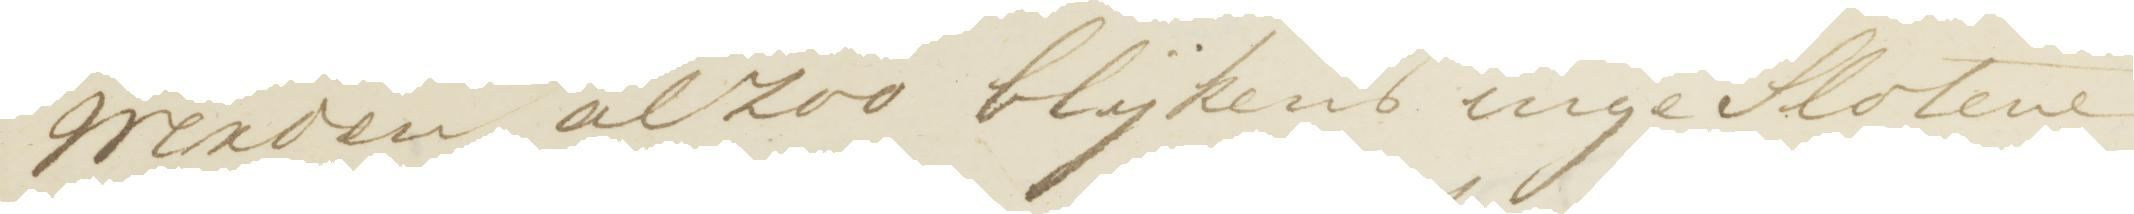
werden alzoo blijkens ingeslotene
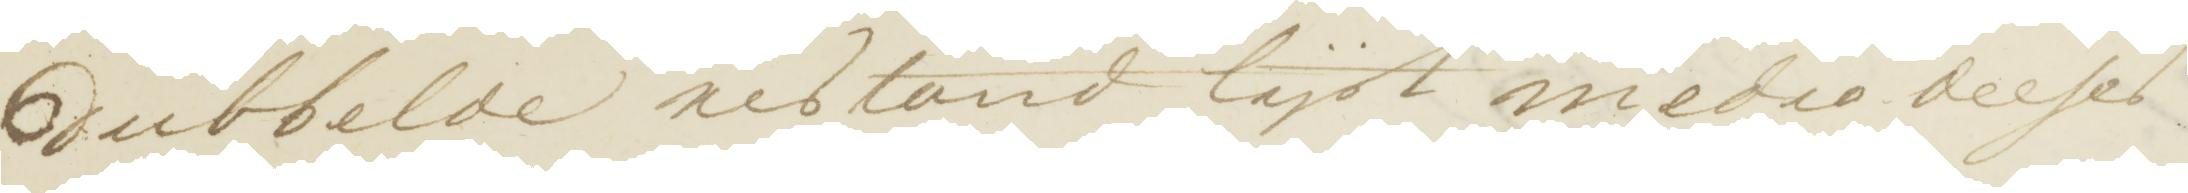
dubbelde restand lijst medio deeses
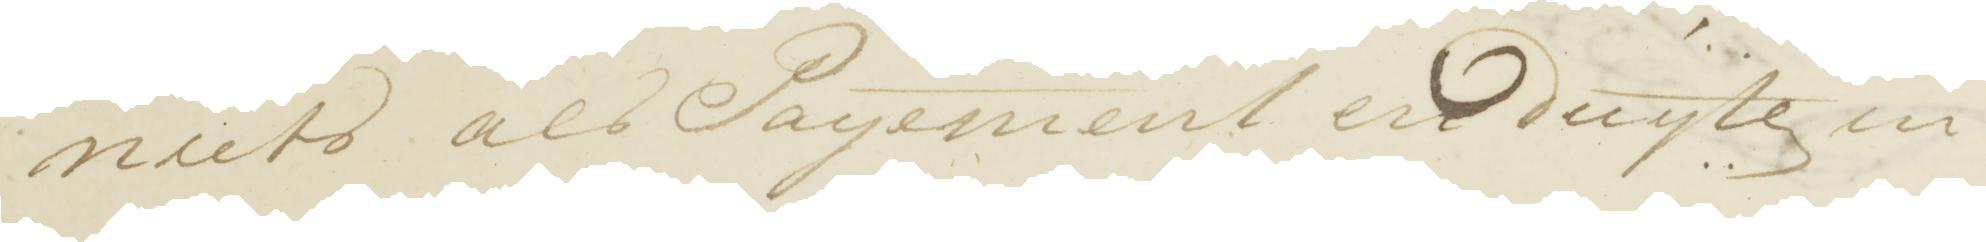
niets als paijement en duijte in
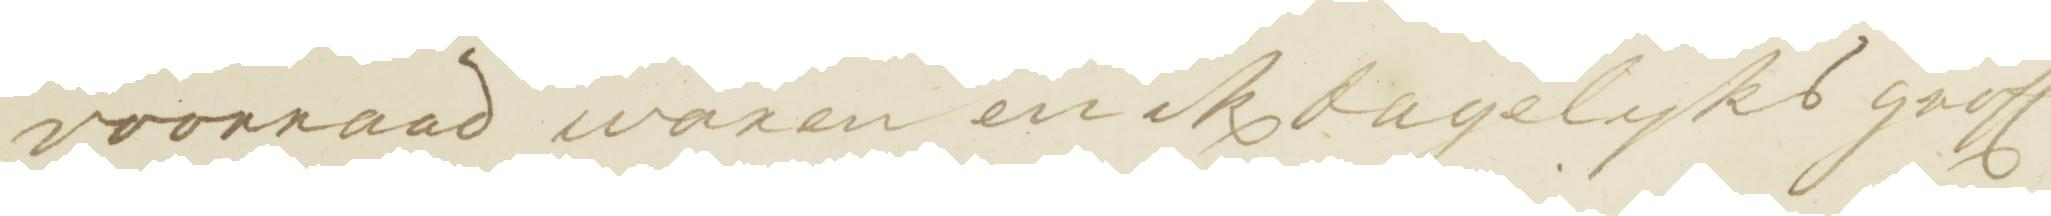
voorraad waren en dagelijks groff
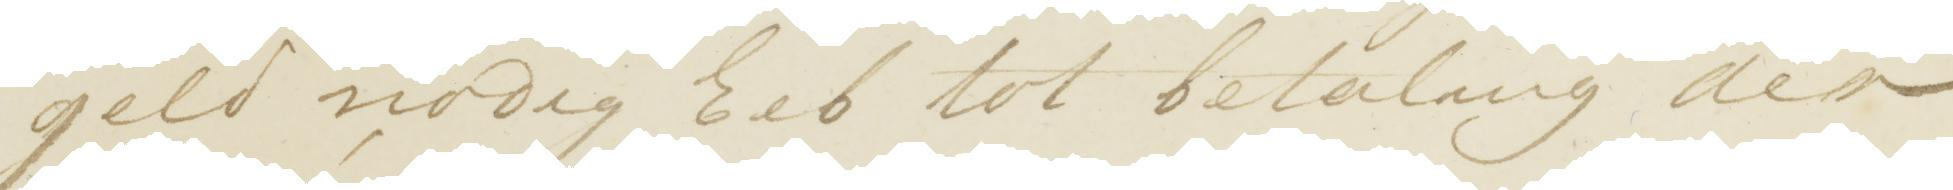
geld nodig heb tot betaling der
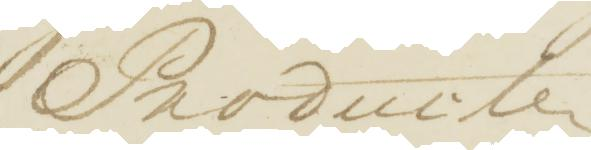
Producten
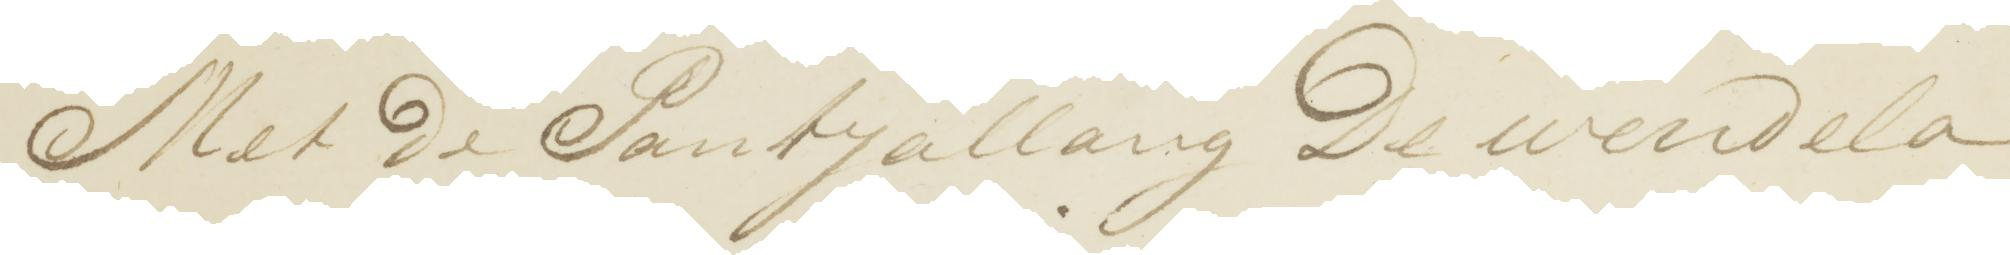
Met de Pantjallang De wendela
